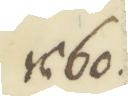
1560
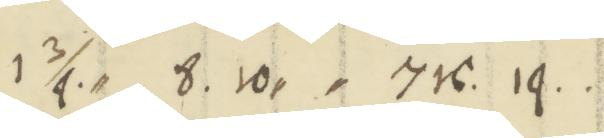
1¾. „ 8. 10„ „ 715. 14. .
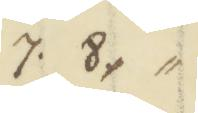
7. 8„ „
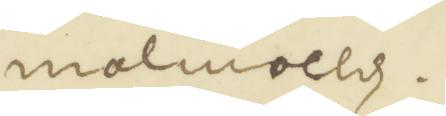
malmoelen -
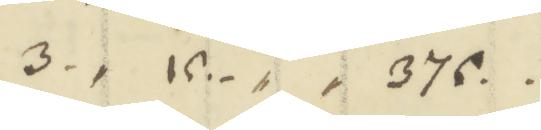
3 - „ 15. - „ „ 375.
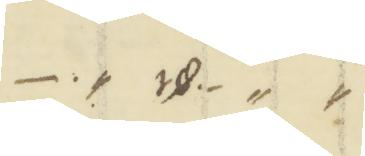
– . „ 18.- „ „
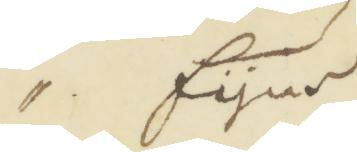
„ . fijne
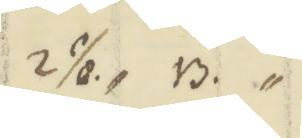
2 5/8. „ 13. „
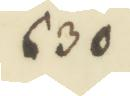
530
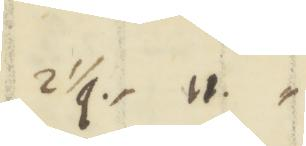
2¼. „ 11. „
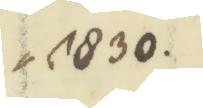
„ 5830.
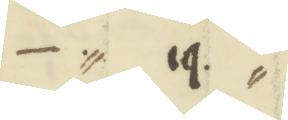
- .„ 14. „
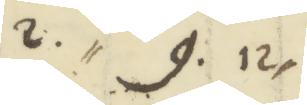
2. „ 9. 12„
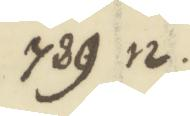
739 12
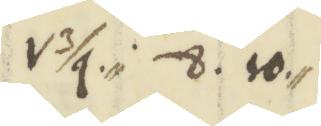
1¾.„ 8.10.„
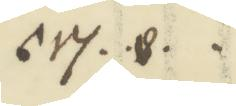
517. .8. .
